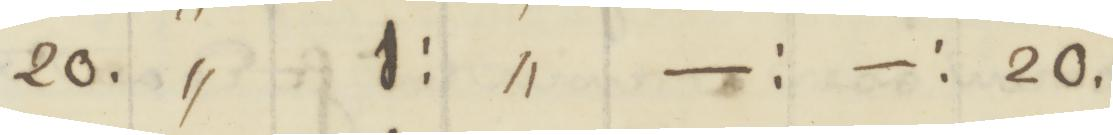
20. „ 1: „ — : — : 20.
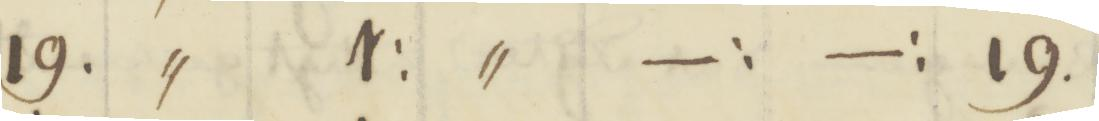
19. „ 1: „ — : — : 19.
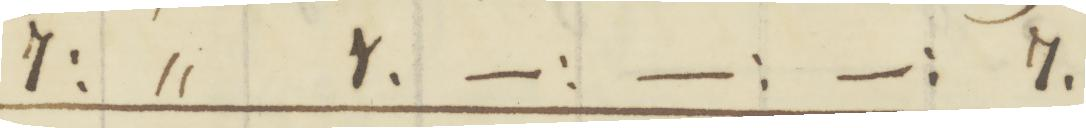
7: „ 1. — : — : — : 7.
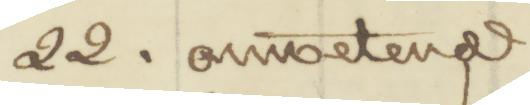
22. onwetende
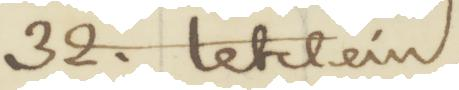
32. teklein
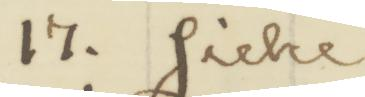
17. sieke
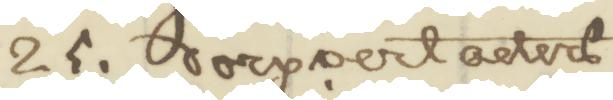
25. dorpverlaeters
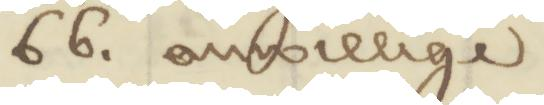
66. onwillige
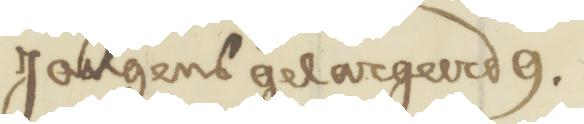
Jongens gelargeerd 9.
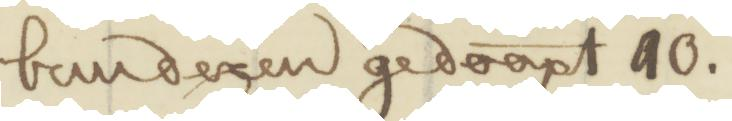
kinderen gedoopt 40.
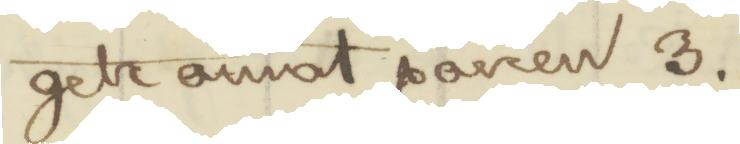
getrouwt paeren 3.
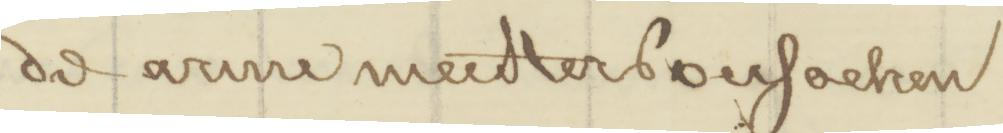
de arme meesters versoeken
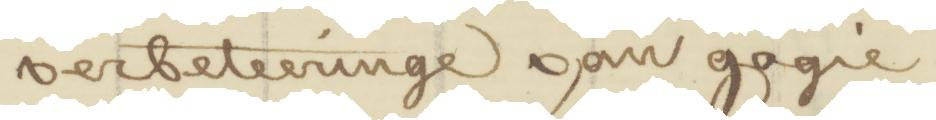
verbeteeringe van gagie
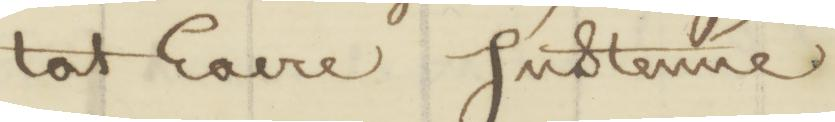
tot haere sustenne
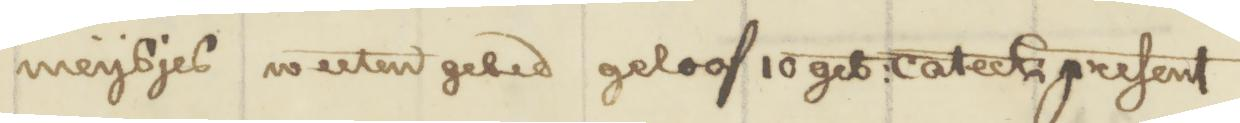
meijsjes weeten gebed geloof 10 geb: cateck present
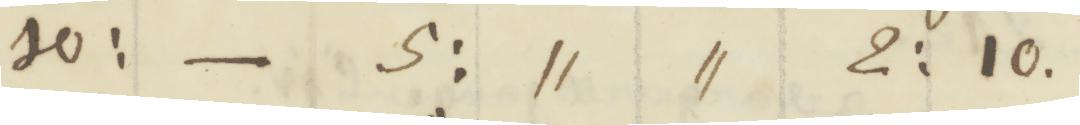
10: — 5: „ „ 2: 10.
